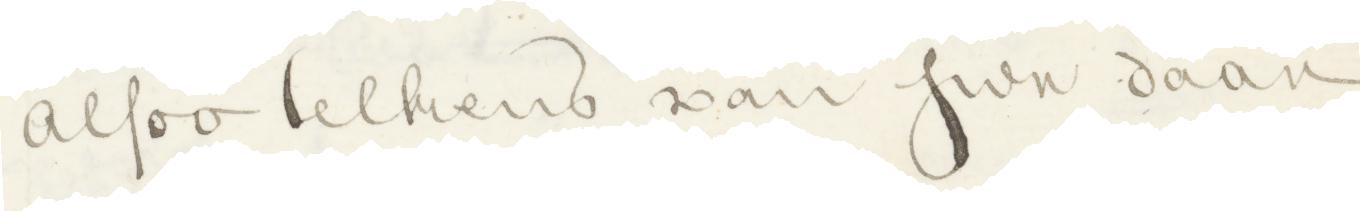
alsoo telkens van hier daar
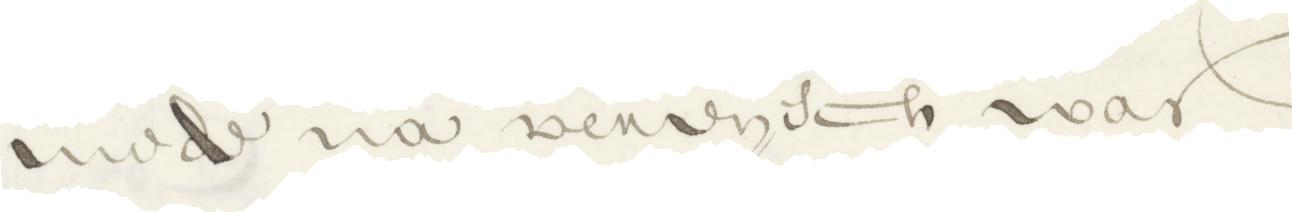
mede na vereijsch was
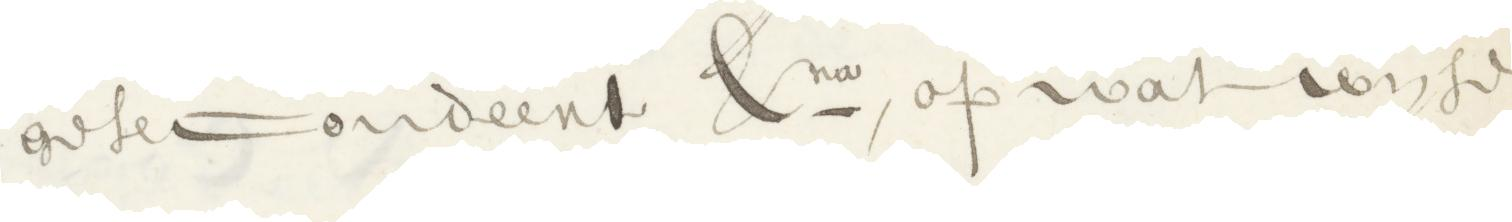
gesecondeert &=ra, op wat wijse
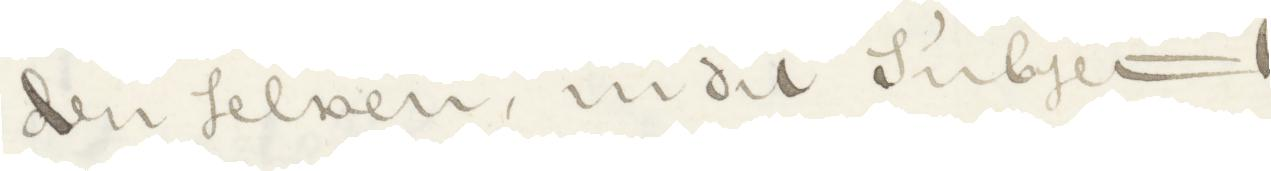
den selven, in dit subject
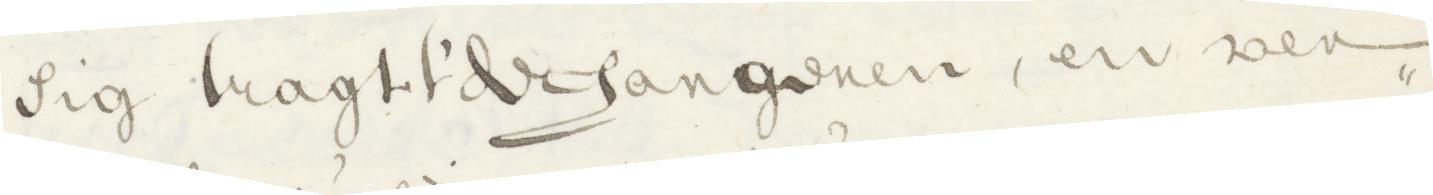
sig tragt t'dechargeren, en ver„
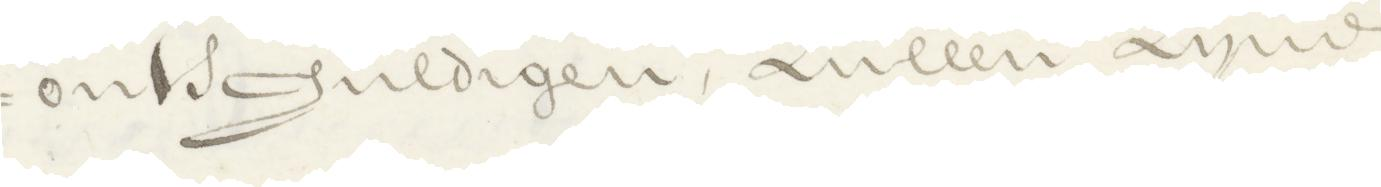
ontschuldigen, zullen zijne
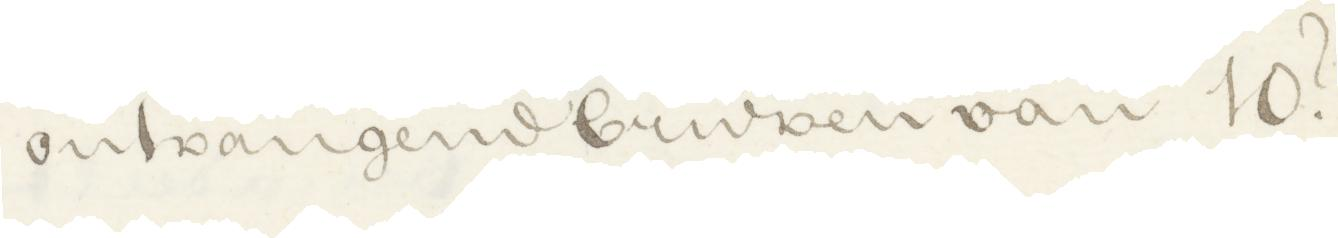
ontvangene brieven van 10?
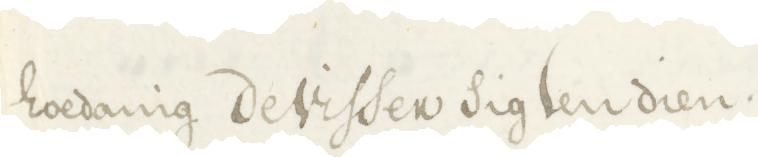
hoedanig de Visser sig ten dien
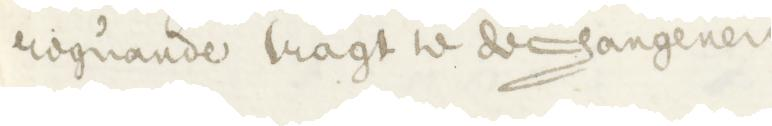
reguarde tragt te dechargeren
